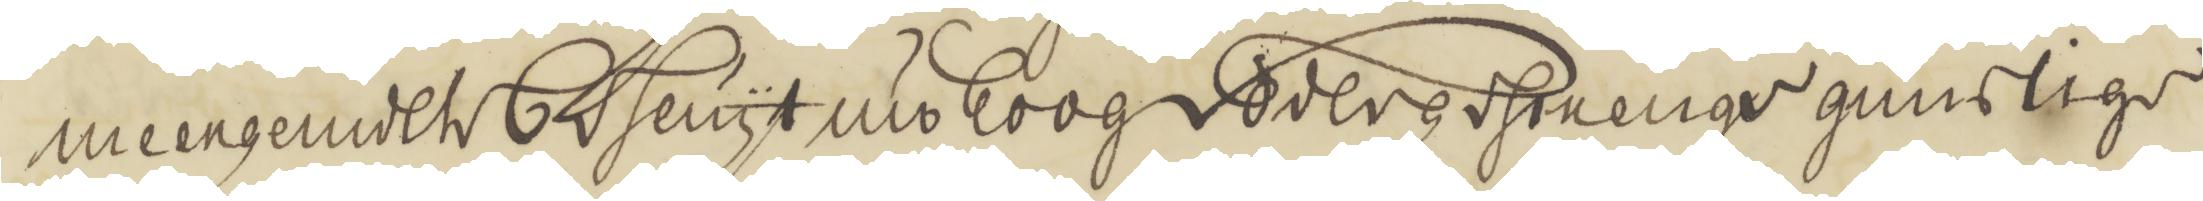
meergemelte besluijt uw hoog Edele gestrenge gunstige
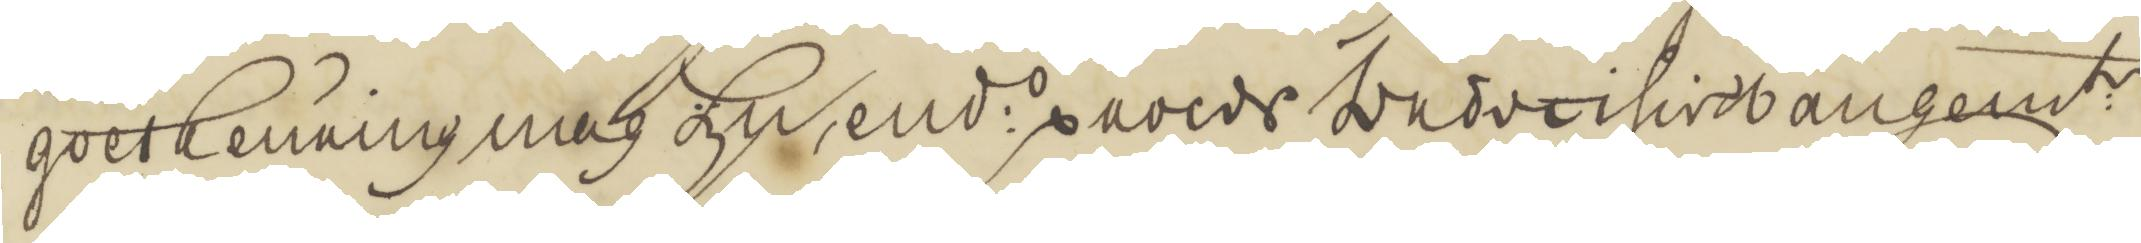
goedkeuring mag sijn, en d:o proces ter decisie van gem:te
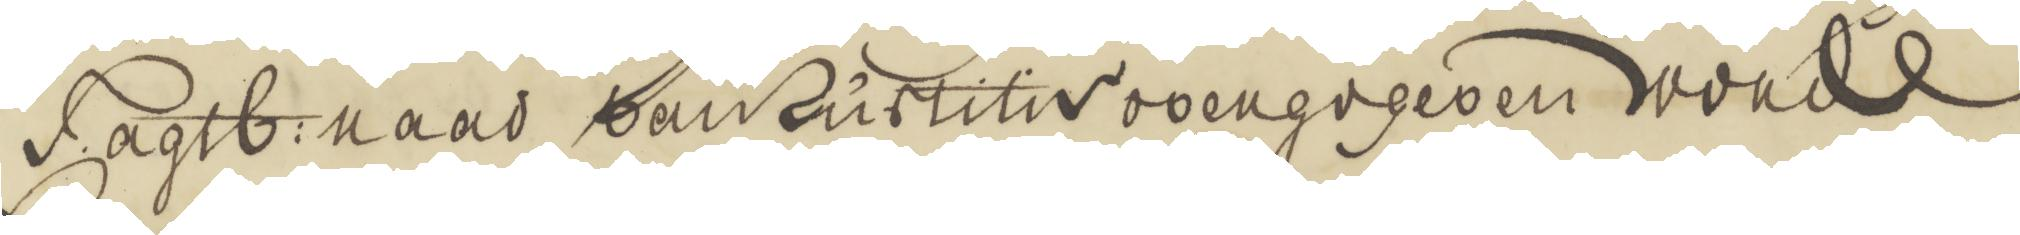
E. agtb: raad van Justitie overgegeven werde
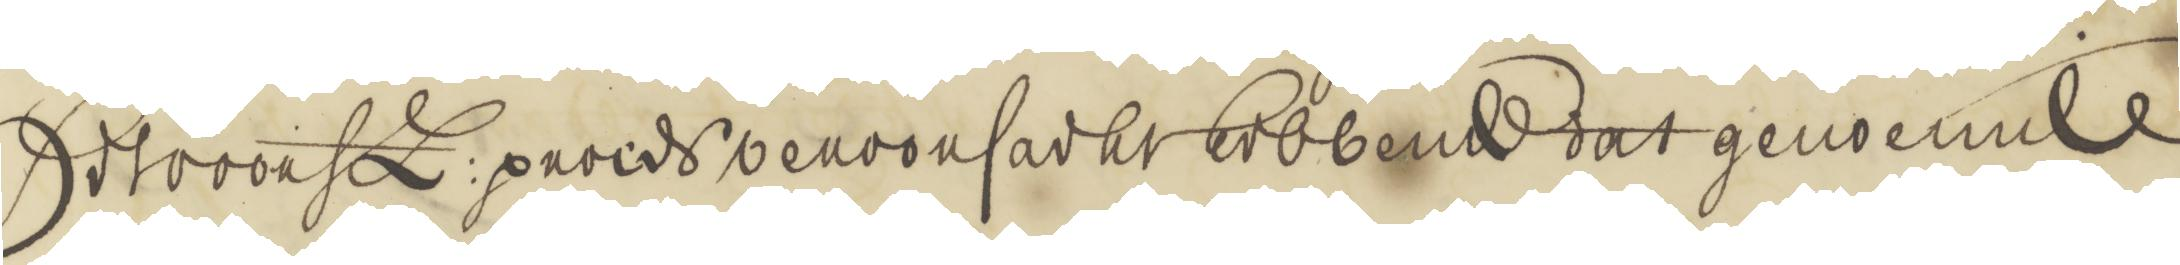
Het voorsz: proces veroorsaekt hebbende dat genoemde
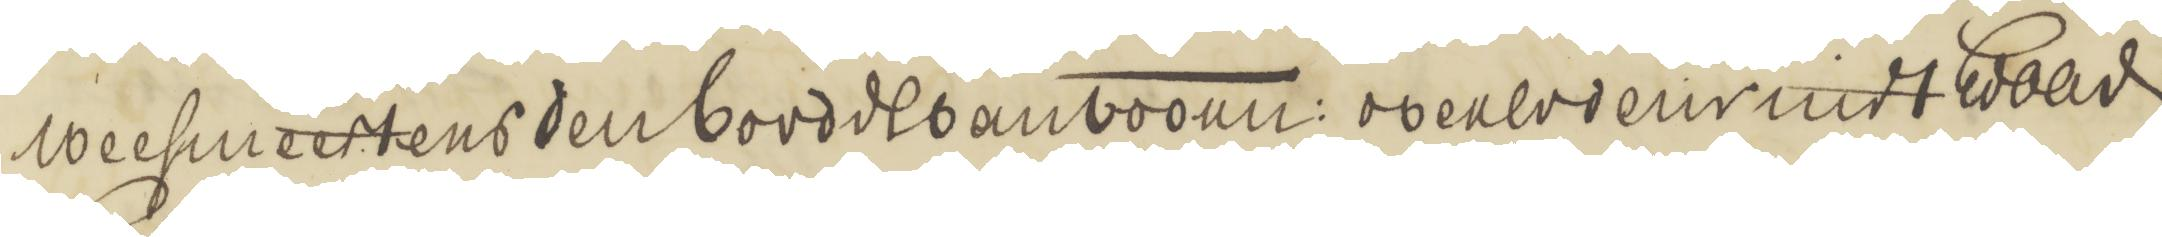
weesmeesters boedel van voorn: overledene niet hebben
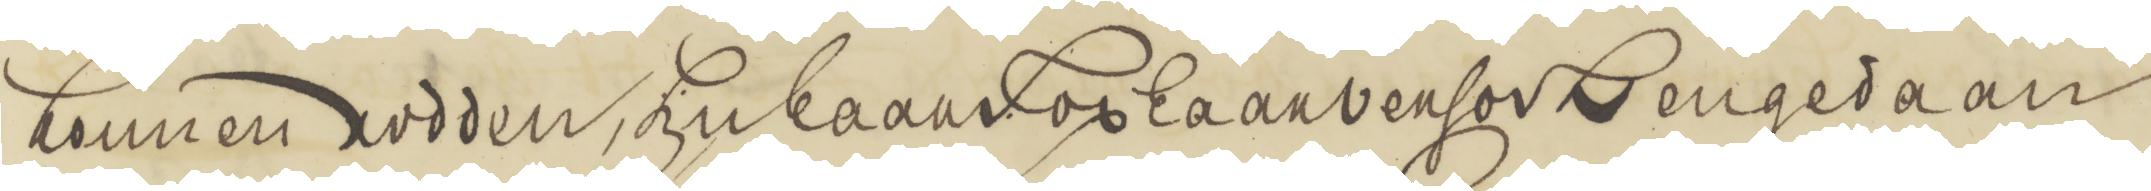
konnen redden, sijn haar E. op haar versoek en gedaan
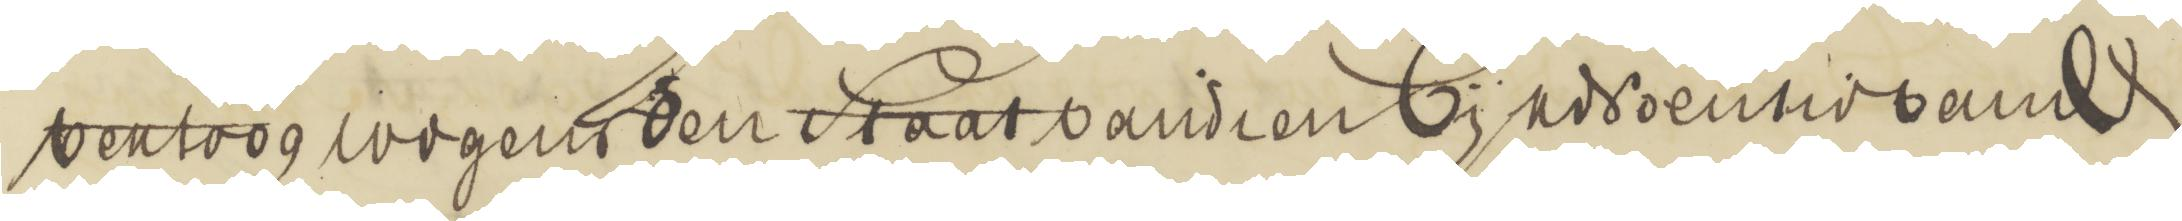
vertoog wegens den staat van dien bij resolutie van den
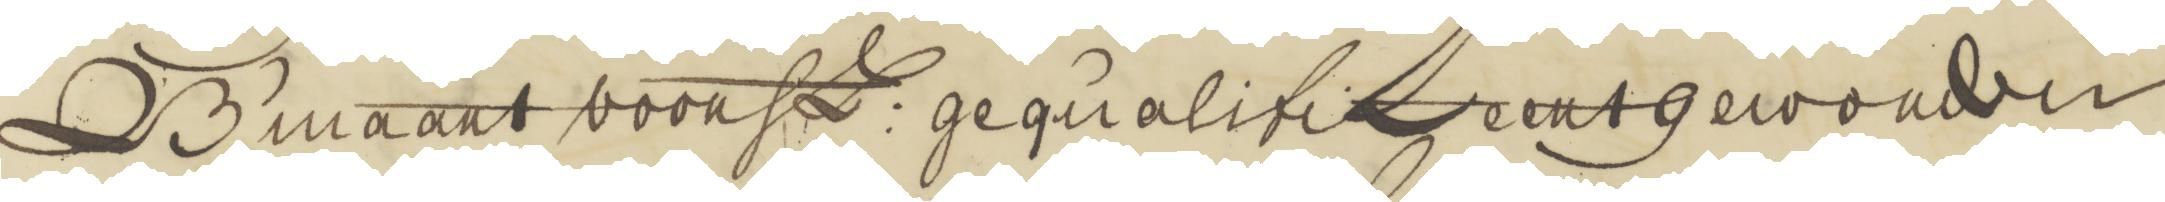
23' maart voorsz: gequalificeert geworden
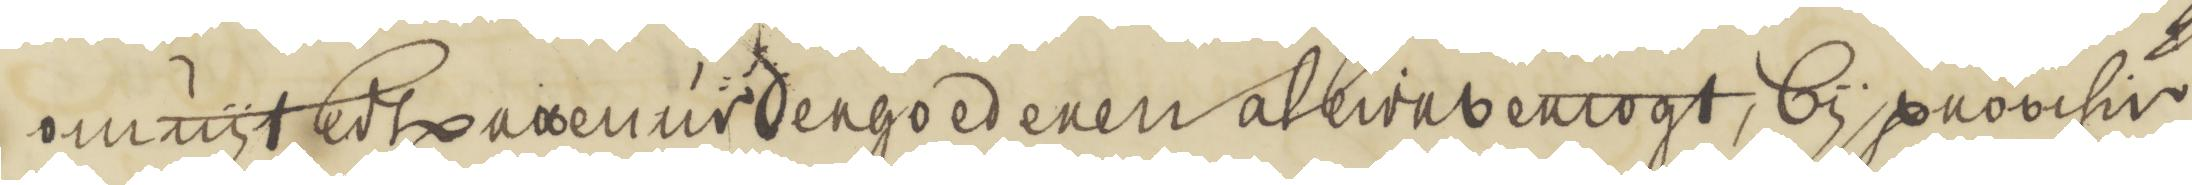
om uijt het prevenue der goederen alhier vercogt, bij provisie
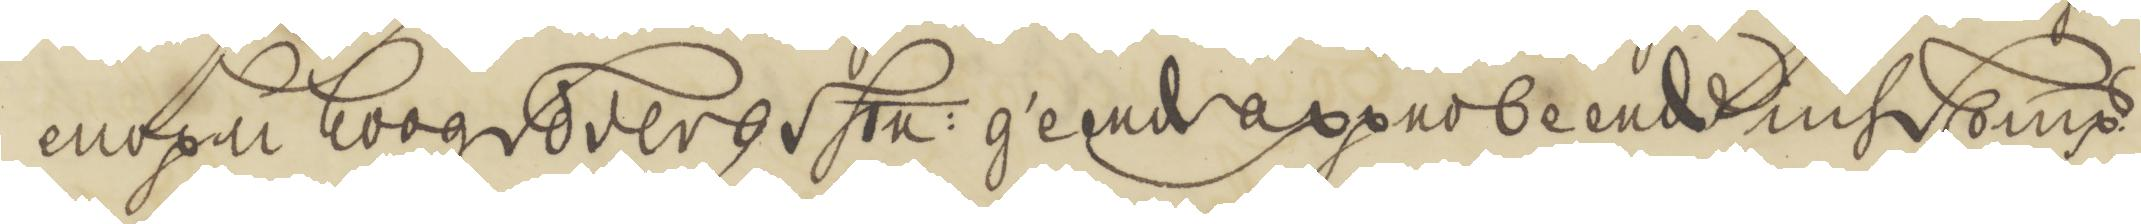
en op u hoog Edele gestr: g’eerd approbeerde in 's EComp.s
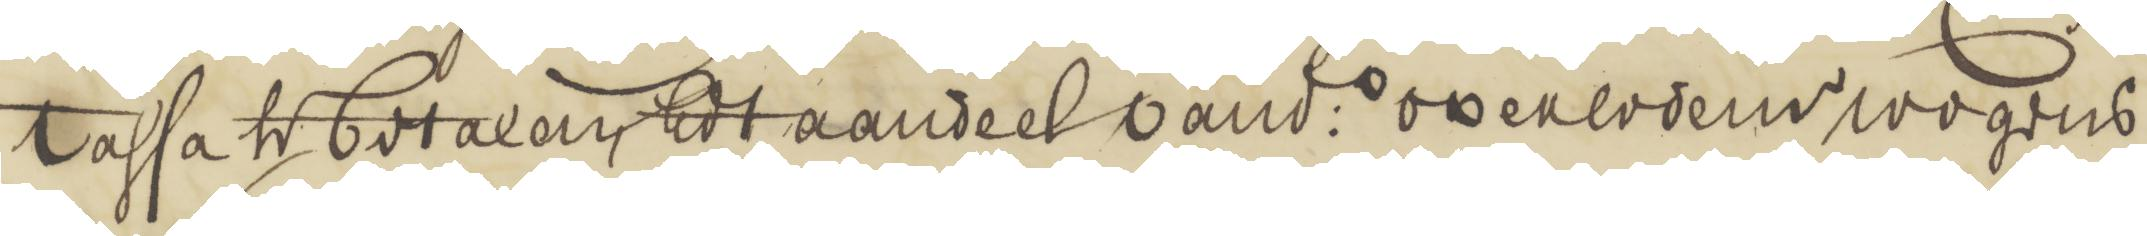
Cassa te betalen, het aandeel van d:o overledene wegens
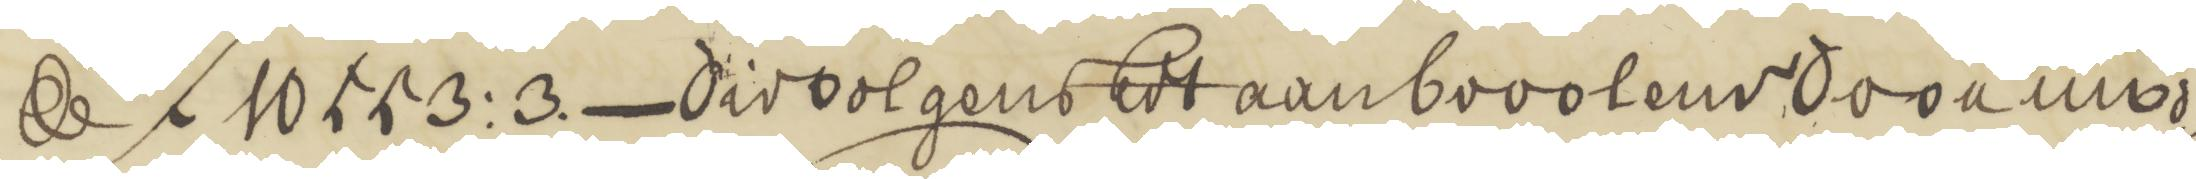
de ƒ 10553:3.— die volgens tot aan bevolene door uw d
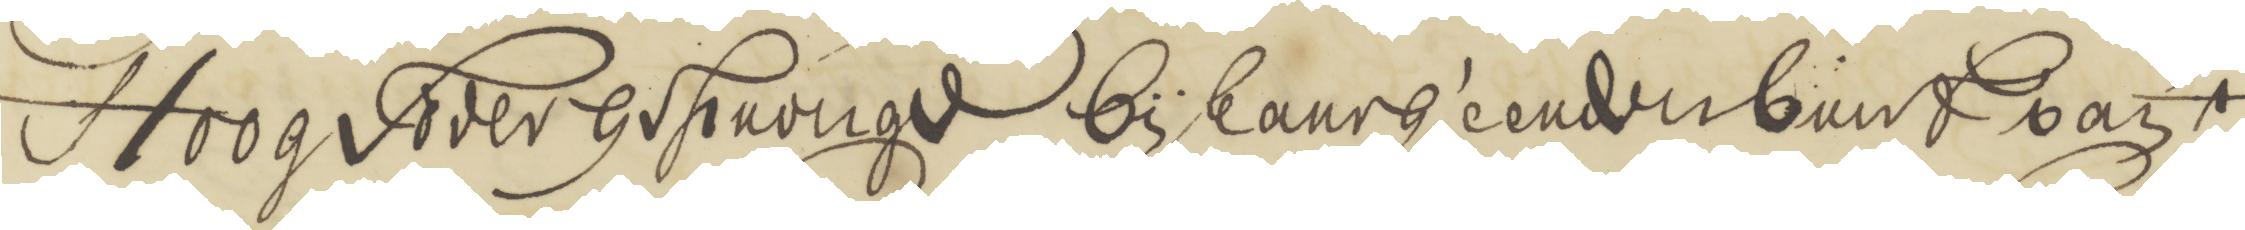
Hoog Edele gestrenge bij hare g'eerden brief van 't
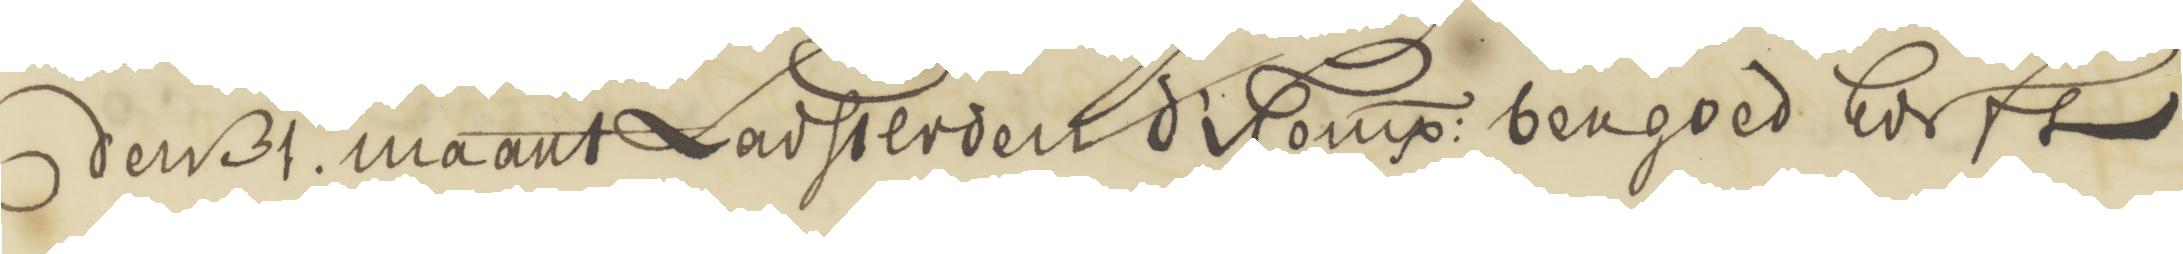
den 31.' maart Laestleden d’ EComp: vergoed heeft
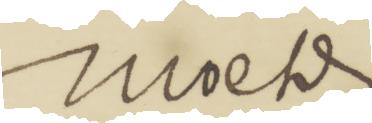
moeten
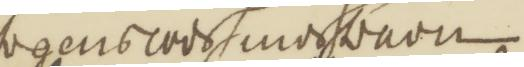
tegens weesmeesteren
